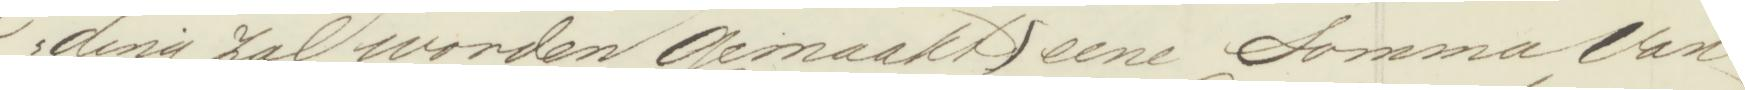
„ding zal worden gemaakt) eene somma van
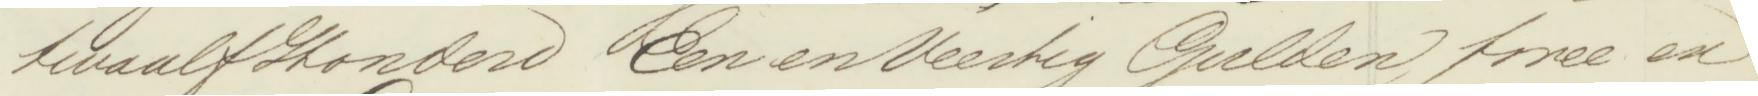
twaalf Honderd Een enVeertig Gulden, twee en
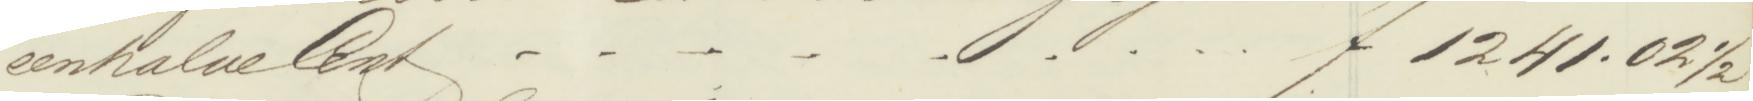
een halve Cent - - - - - - - - - ƒ 1241.02½
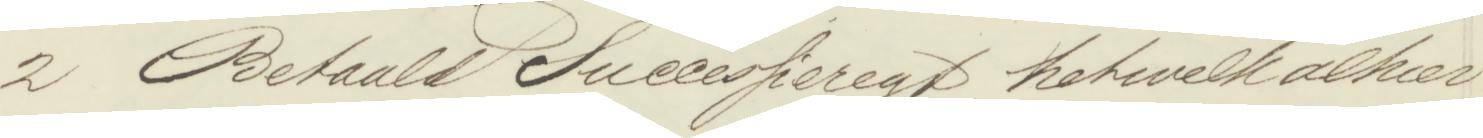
2 Betaald Successieregt hetwelk alhier
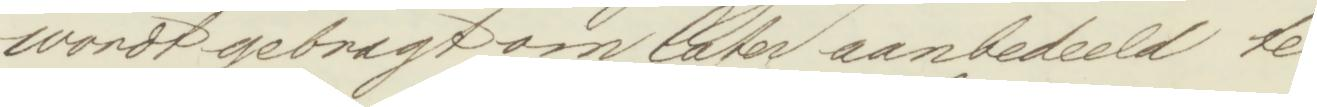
wordt gebragt om later aanbedeeld te
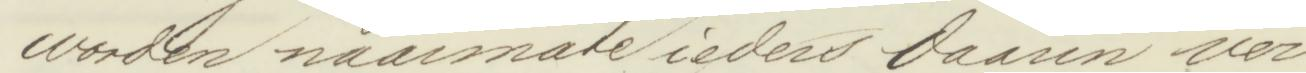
worden naarmate ieders daarin ver
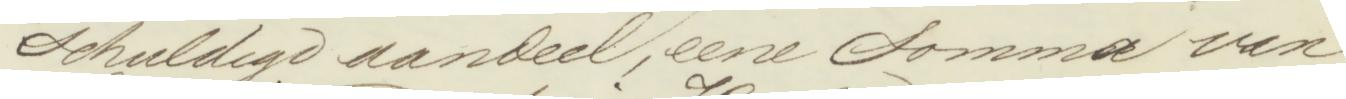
schuldigd aandeel, eene somma van
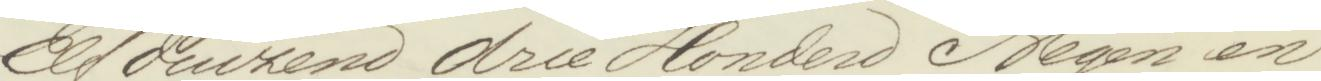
Elf duizend drie Honderd Negen en
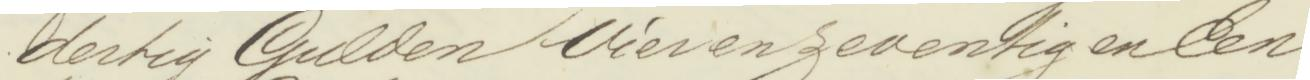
dertig Gulden vier en zeventig enEen
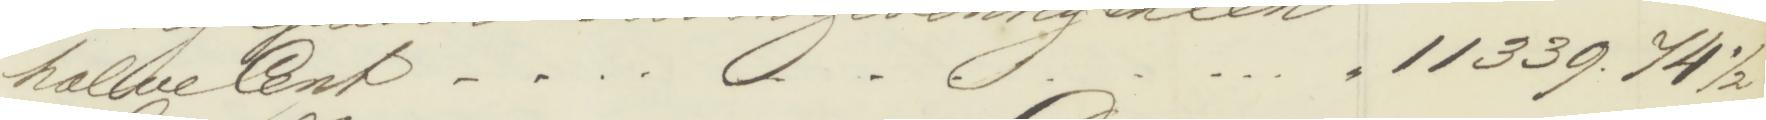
halve Cent - - - - - - - - - - - „ 11339. 74½
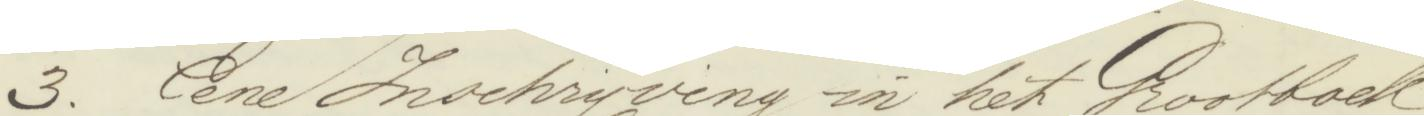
3. Eene Inschrijving in het Grootboek
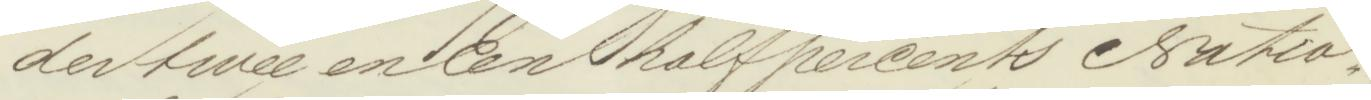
der twee en Een halfpercents Natio„
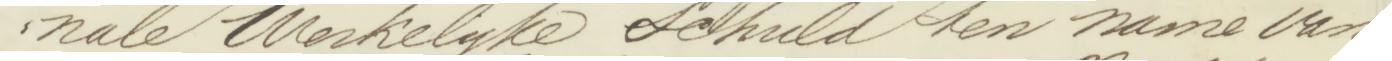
„nale Werkelijke schuld ten name van
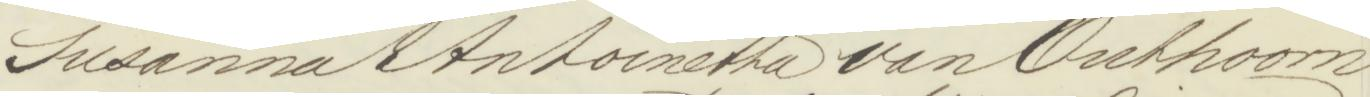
Susanna Antoinetta van Outhoorn
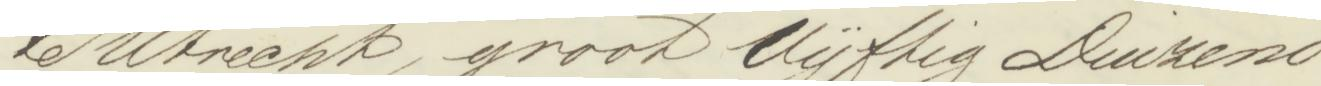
te Utrecht, groot Vijftig Duizend
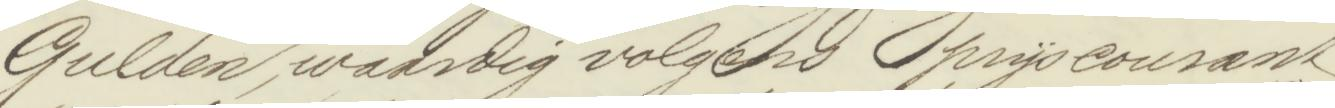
Gulden, waardig volgens prijscourant
